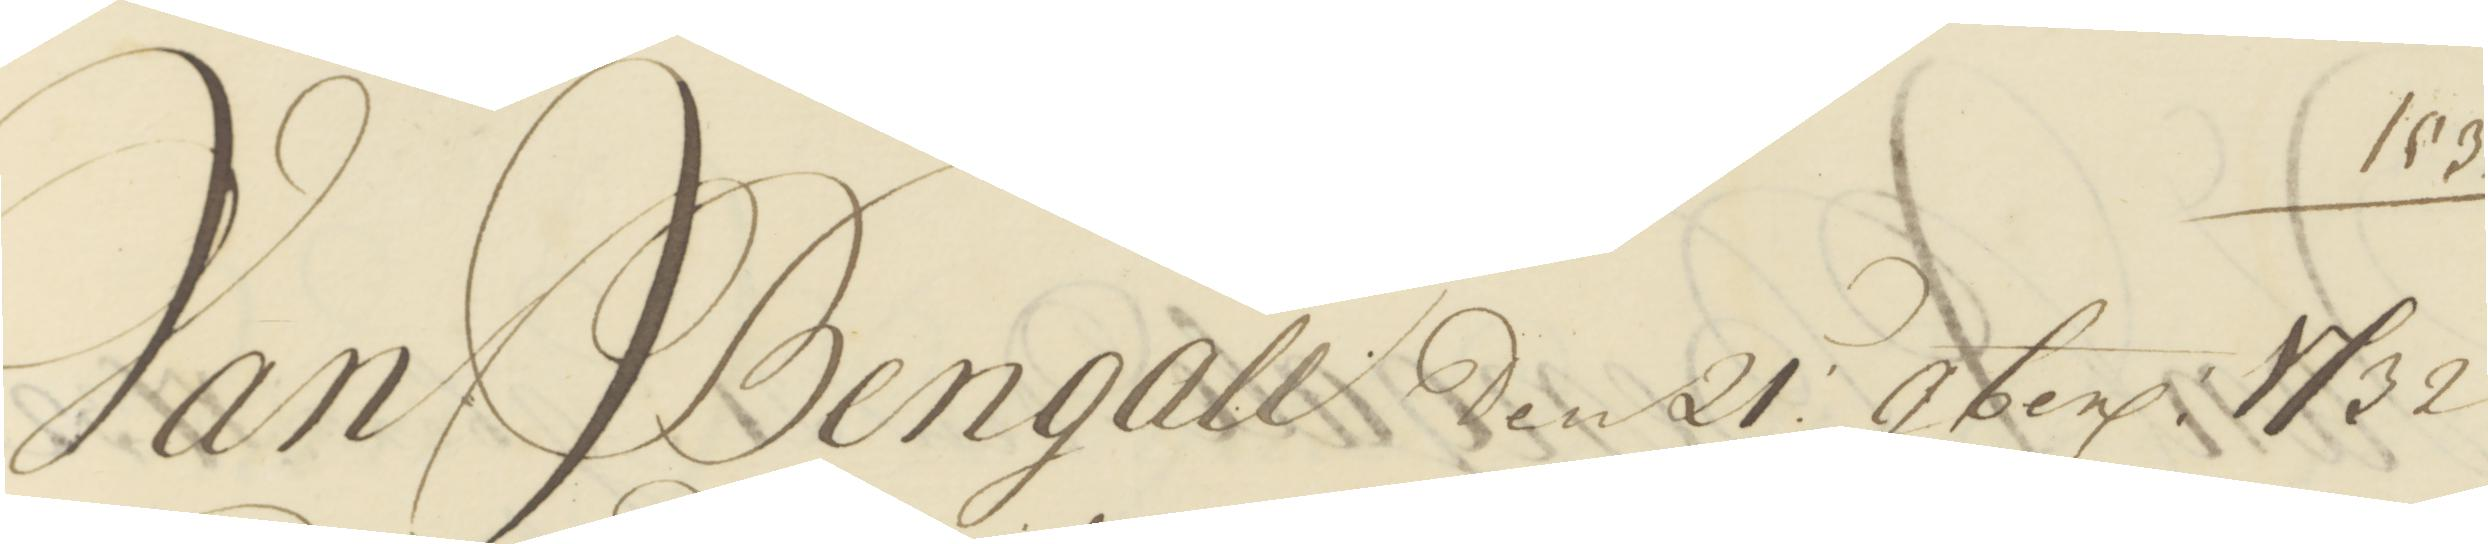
Van Bengale den 21': gber 1732
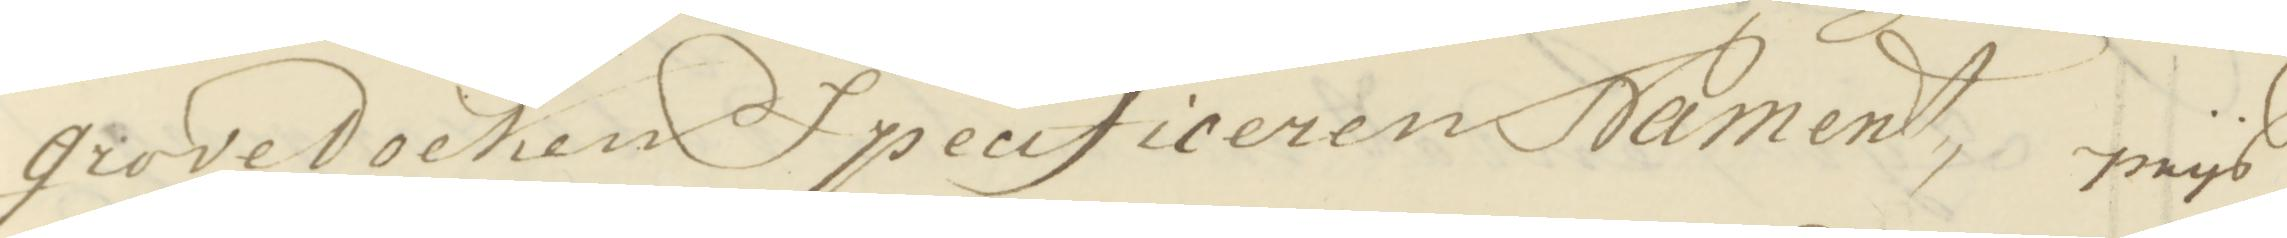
grove doeken Specificeren Nament, prijs
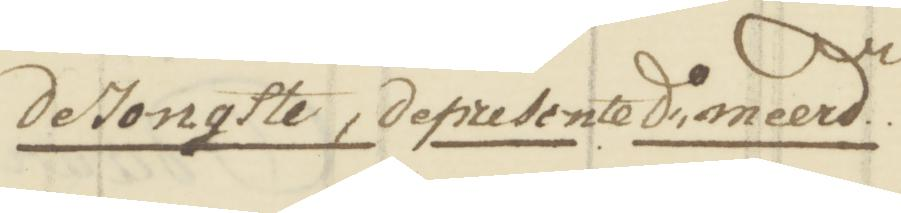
de Jongste, de presente d:o meerd.e
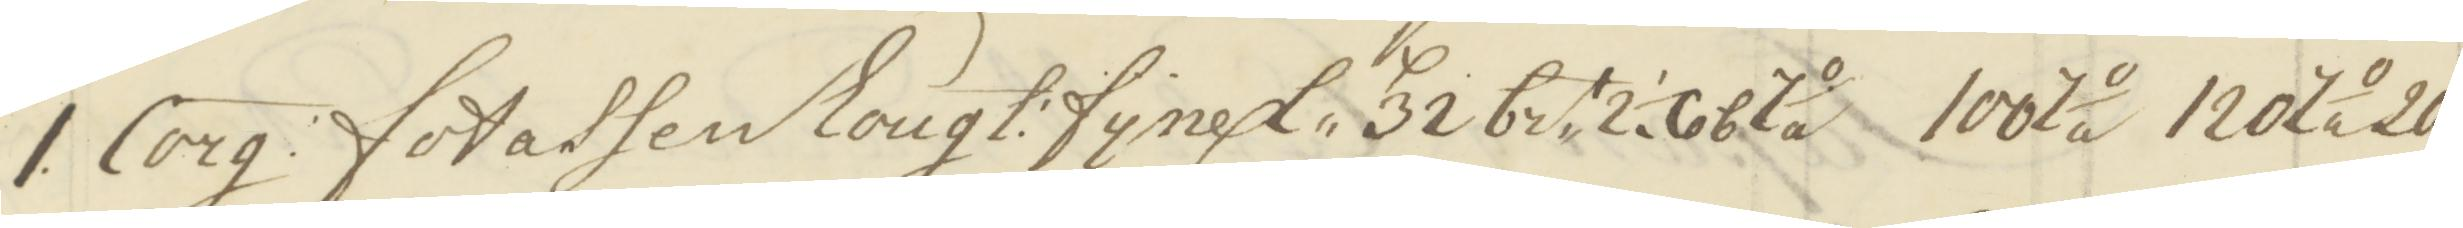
1. Corg: fotassen hougl: fijne l„ 32 br:t 2½ cob r:o/a 100 r:o/a 120 r:o/a 20.
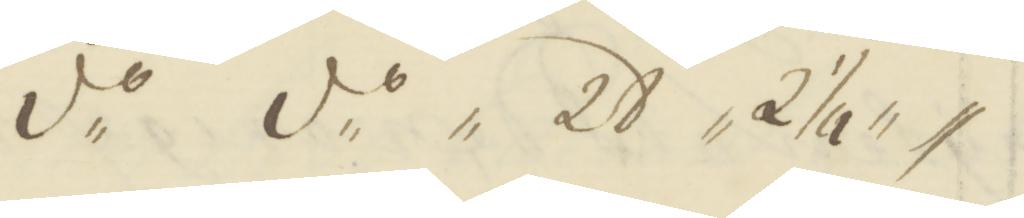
d„o d„o „ 28 „2¼„ „
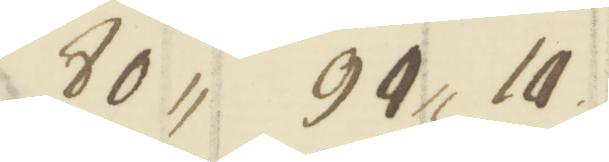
80 „ 94„ 14.
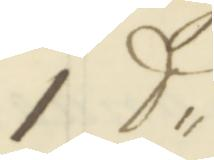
1. d„o
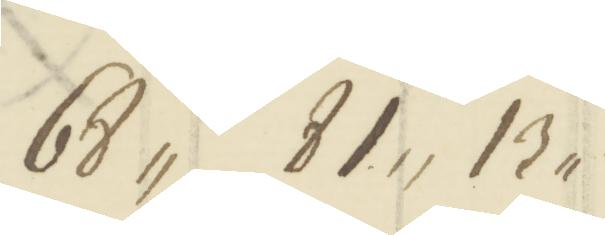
68„ 81„ 13„
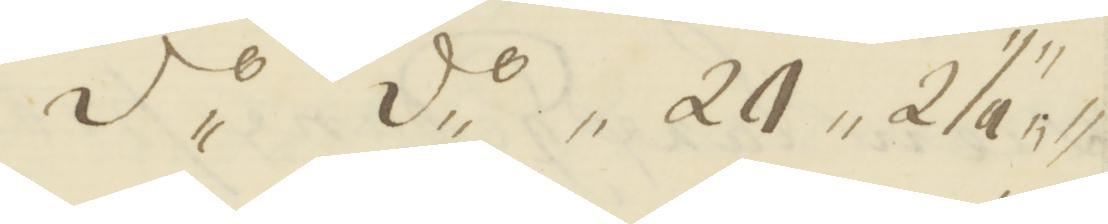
d„o d„o „ 24 „ 2¼ „ „
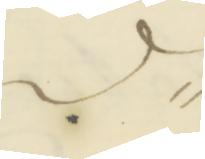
1 „ d„o
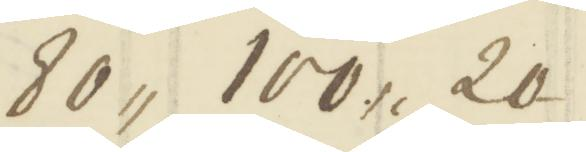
80„ 100„ 20-
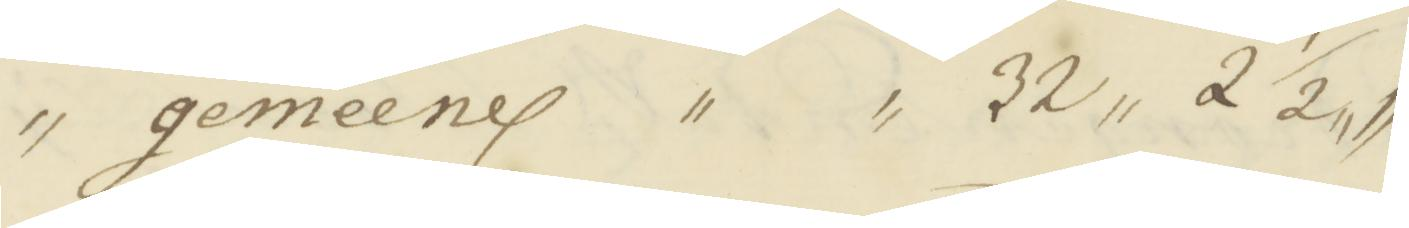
„ gemeene „ „ 32 „ 2½ „ „
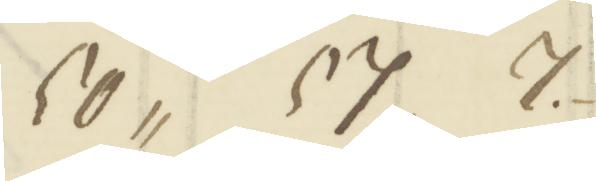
50 „ 57 7.-
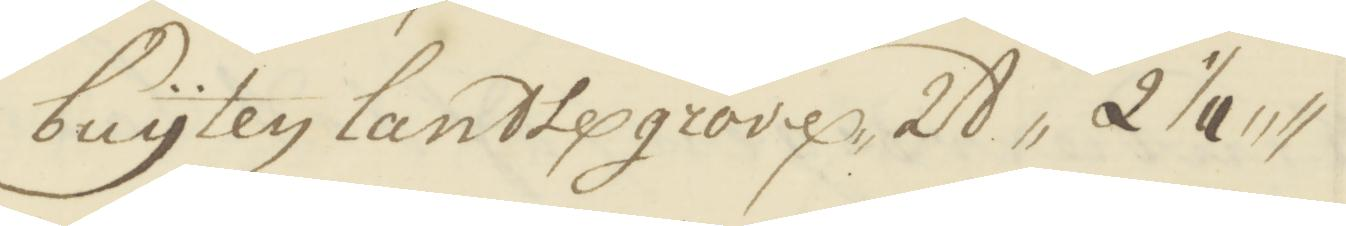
1 „ „ buijten landse grove, 28 „ 2¼„ „
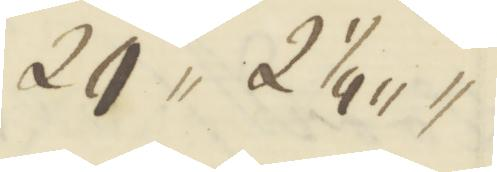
24 „ 2¼ „ „
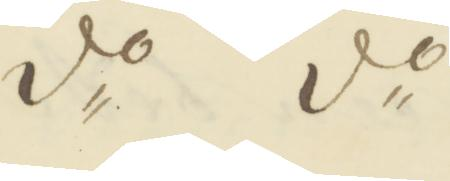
1 „ „ d„o d„o
